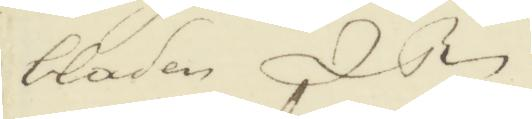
bladen ZR
